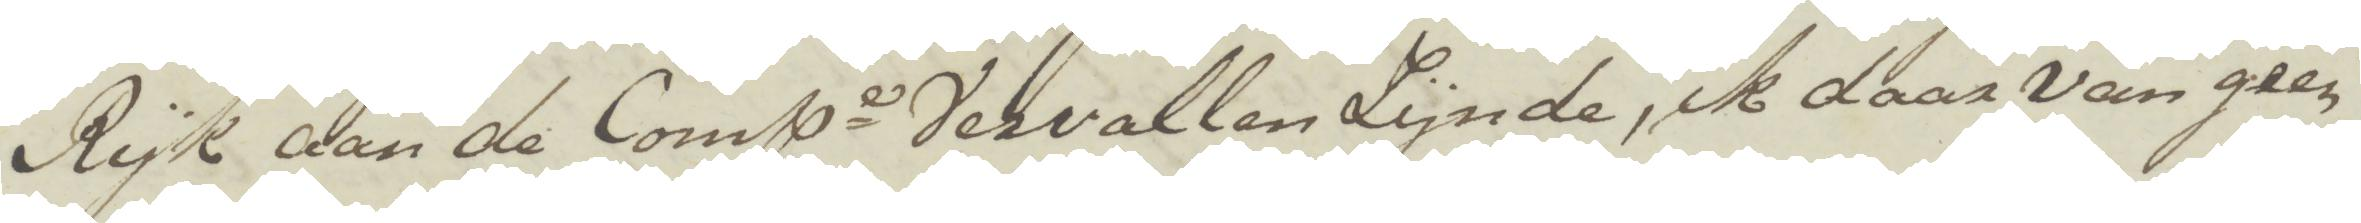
Rijk aan de Comp=e vervallen zijnde, ik daar van geen
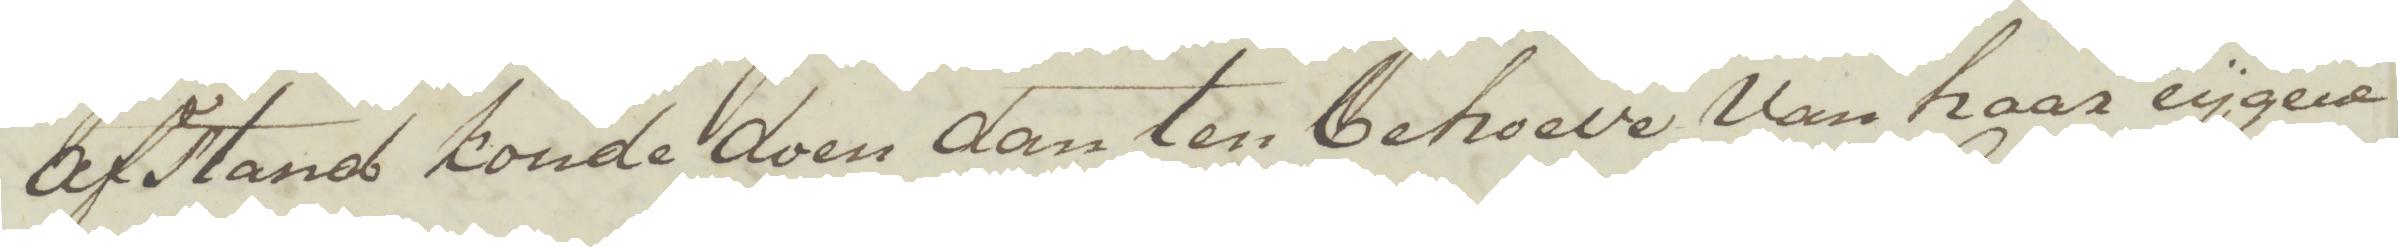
afstand konde doen dan ten behoeve van haar eijgene
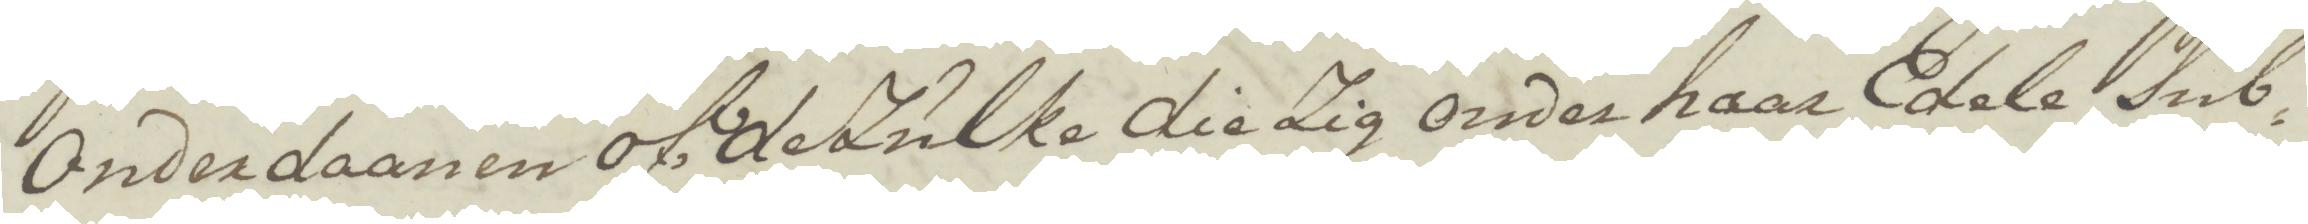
onderdaanen of de zulke die zig onder haar Edele sub„
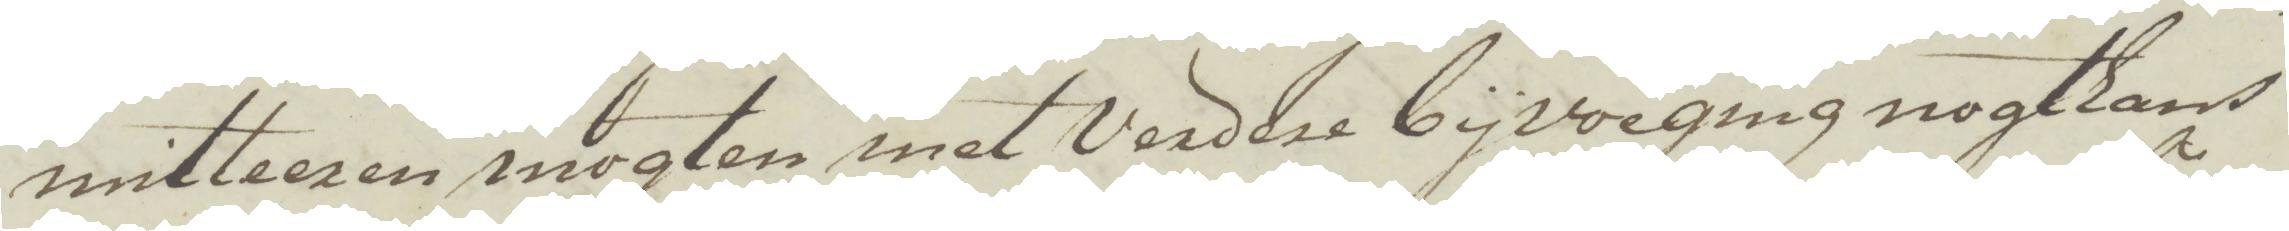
mitteeren mogten met verdere bijvoeging nogthans
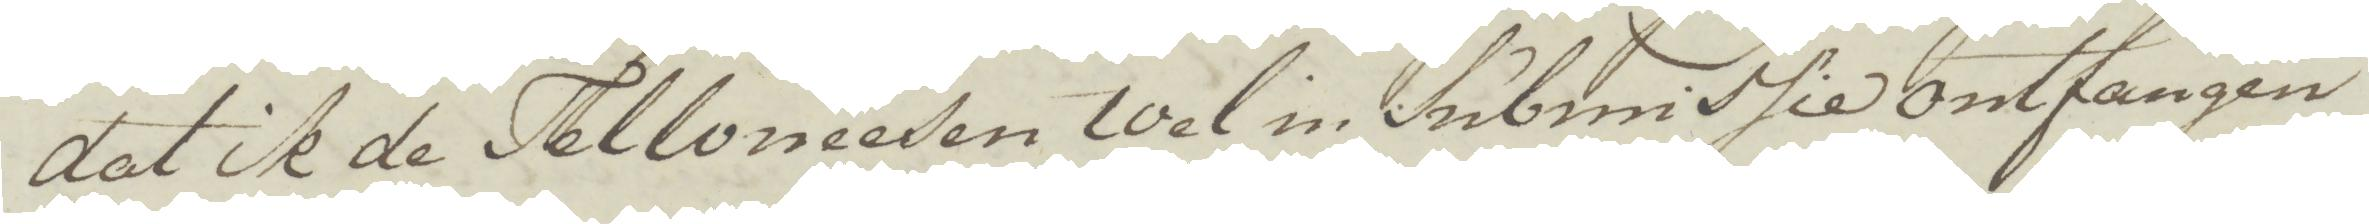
dat ik de Telloneesen wel in submissie ontfangen
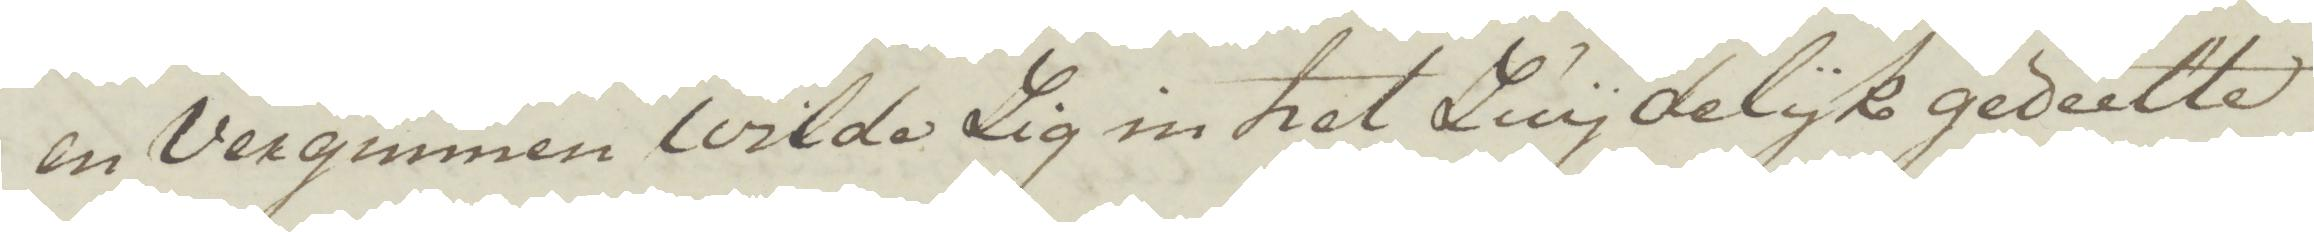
en vergunnen wilde zig in het zuijdelijk gedeelte
